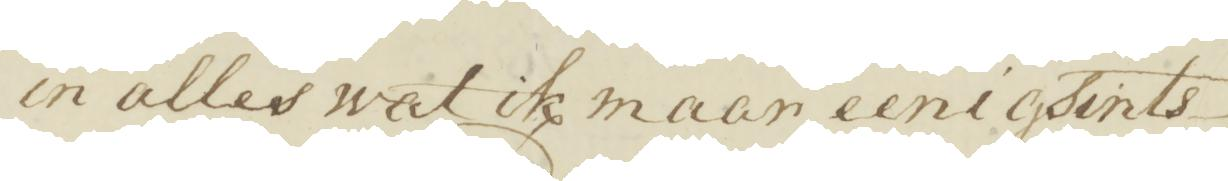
in alles wat ik maar eenigsints
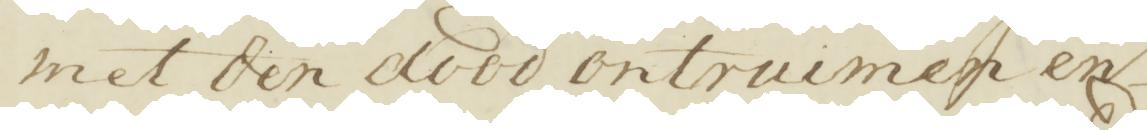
met den dood ontruimen en
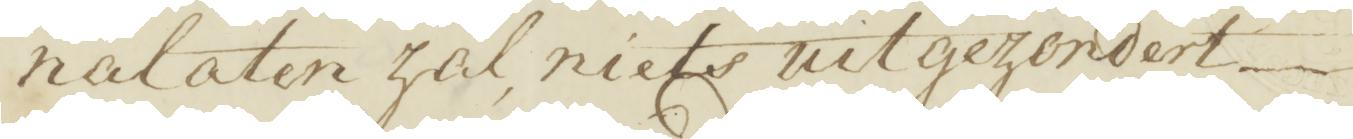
nalaten zal, niets uitgezondert-
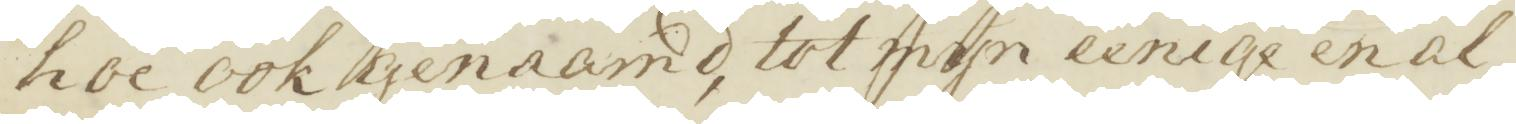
hoe ook genaamd, tot myn eenige en al
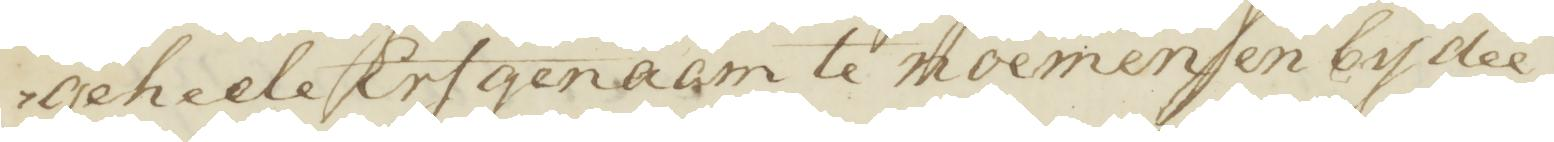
„geheele Erfgenaam te noemen en by dee
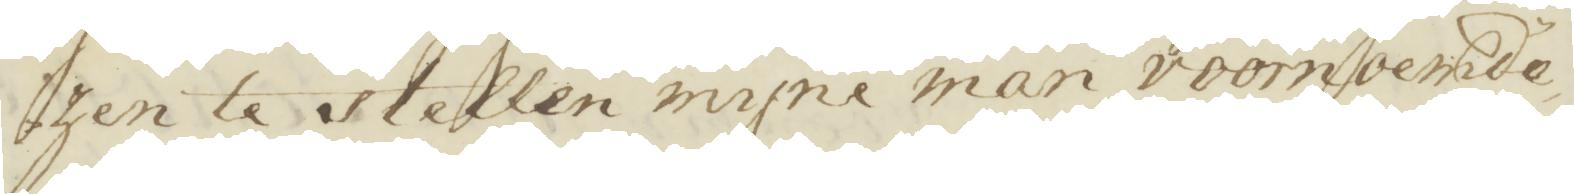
zen te stellen myne man voornoemde
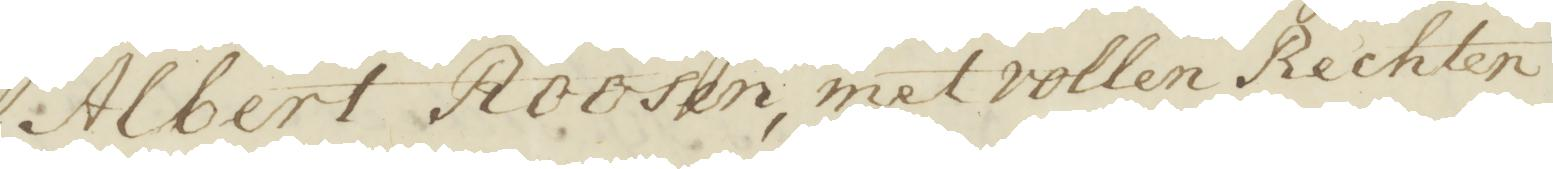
Albert Roosen, met vollen Rechten
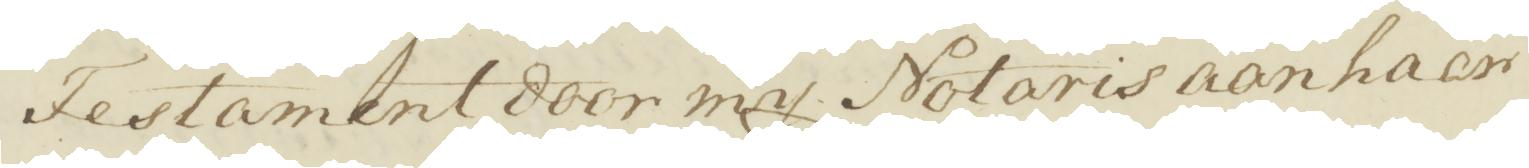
Testament door my Notaris aan haar
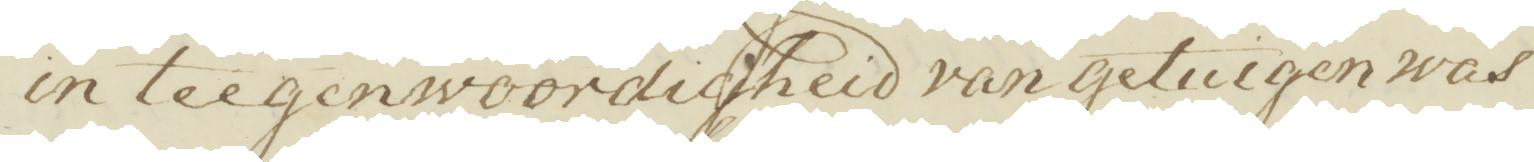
in teegenwoordigheid van getuigen was
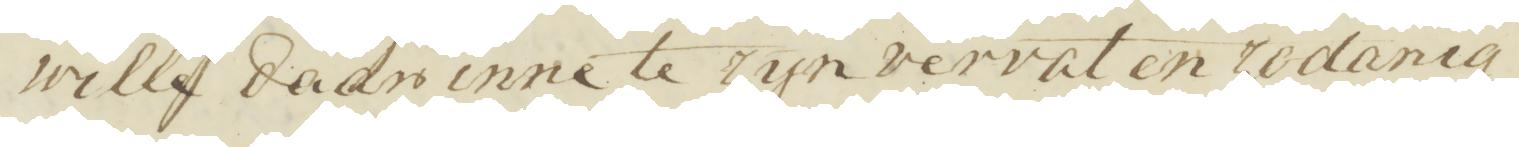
wille daar inne te zijn vervat en zodanig
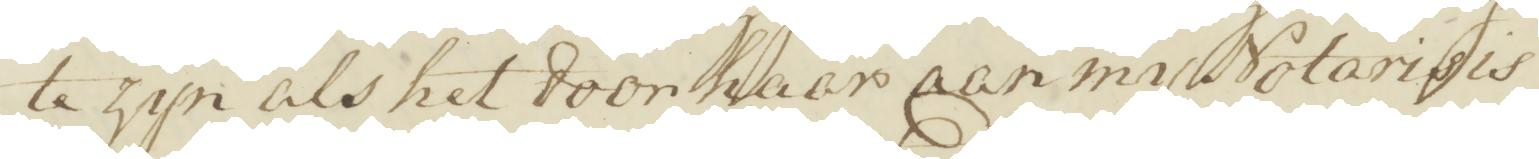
te zyn als het door haar aan my Notaris is
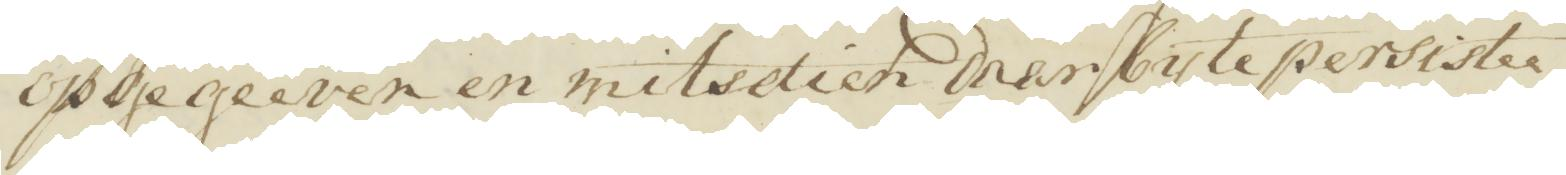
opgegeeven en mitsdien daar by te persistee
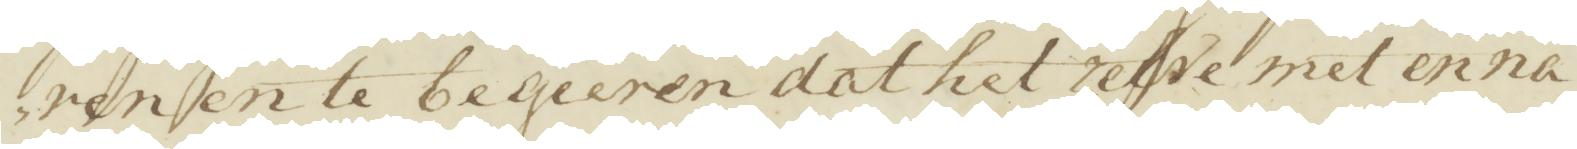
„ren en te begeeren dat het zelve met en na
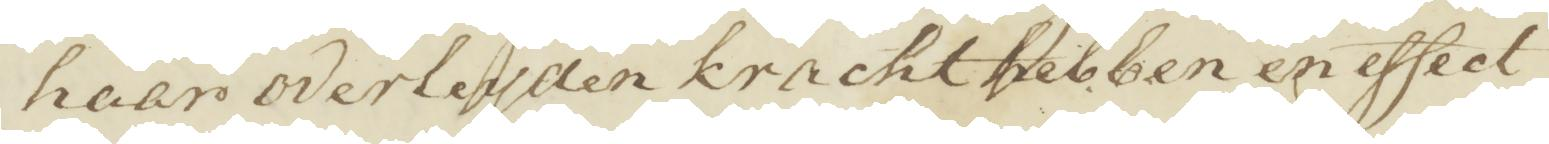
haar overleyden kracht hebben en effect
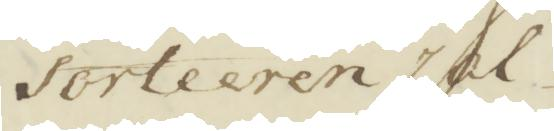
sorteeren zal
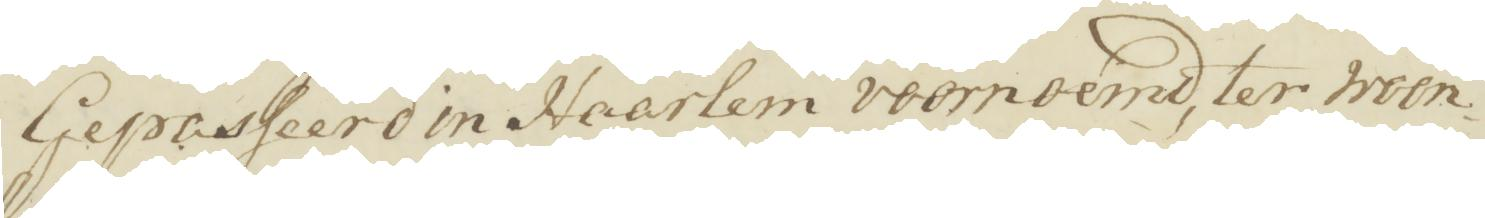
Gepasseerd in Haarlem voornoemd, ter woon
